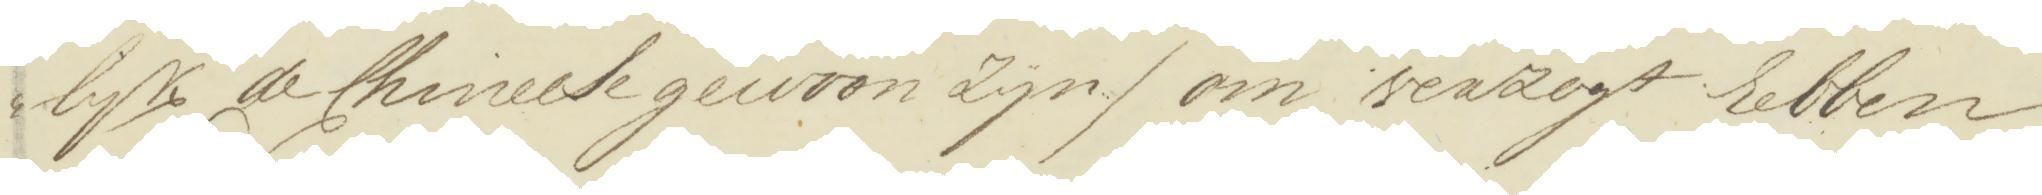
„lijk de Chineese gewoon zijn :/ om verzogt hebben
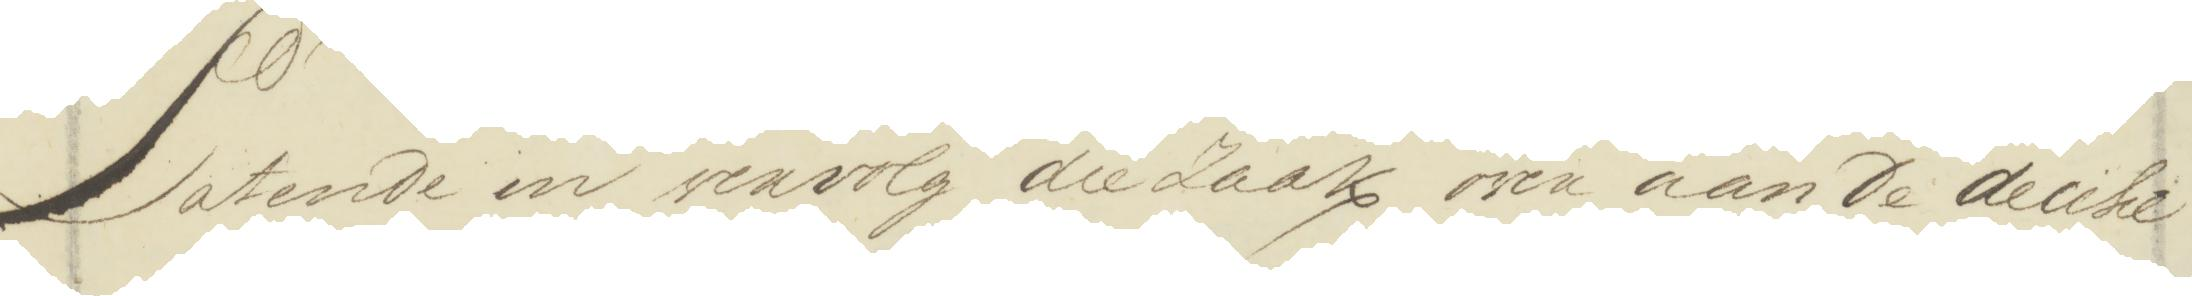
Latende in vervolg die zaak over aan de decische
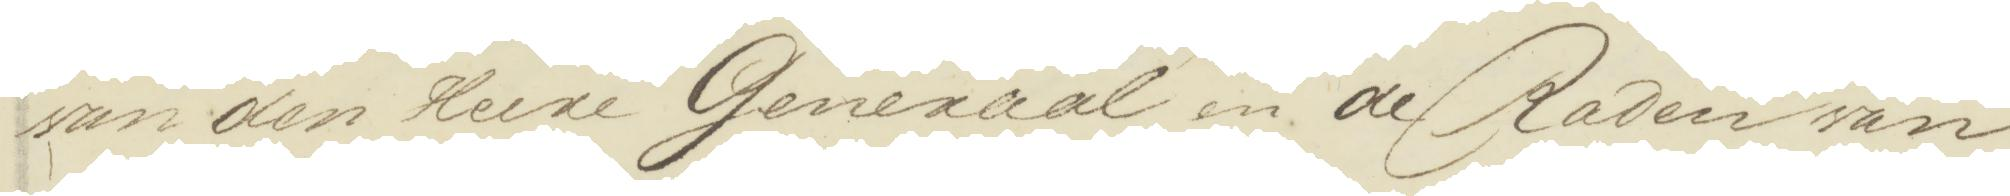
van den Heere Generaal en de Raden van
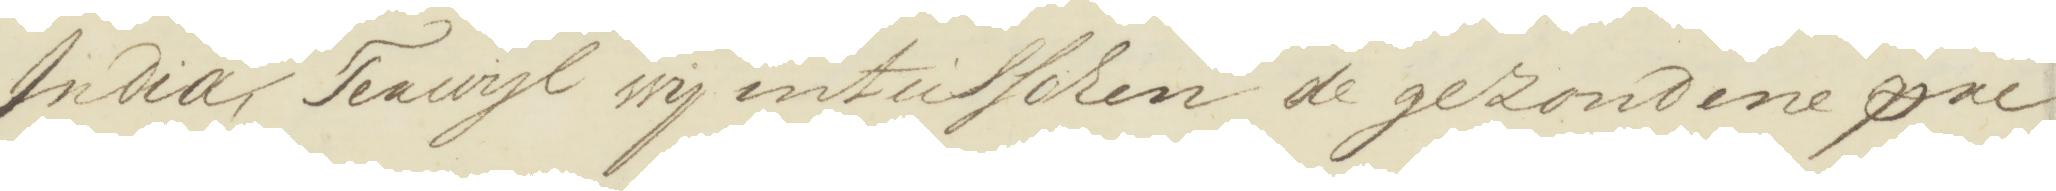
Jndia Terwijl wij intusschen de gezondene pre
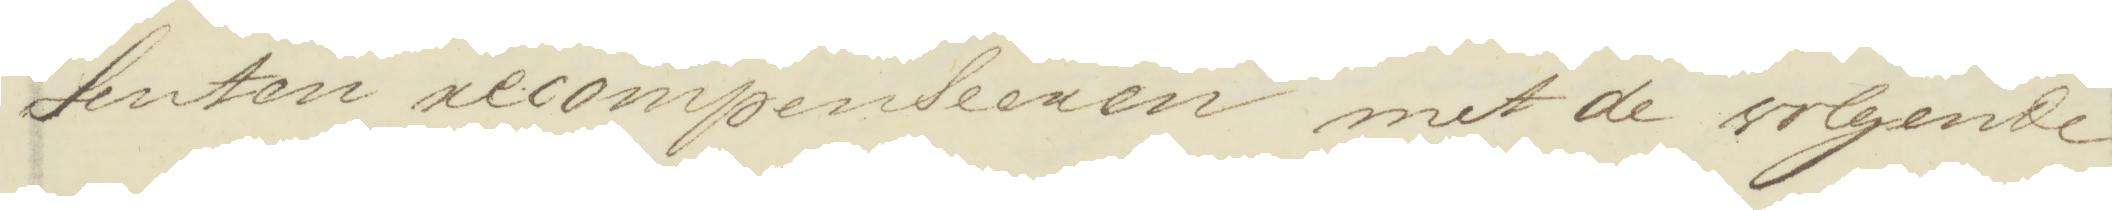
Senten recompenseeren met de volgende
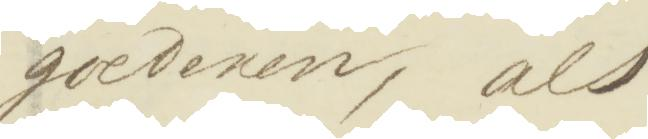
goederen, als
